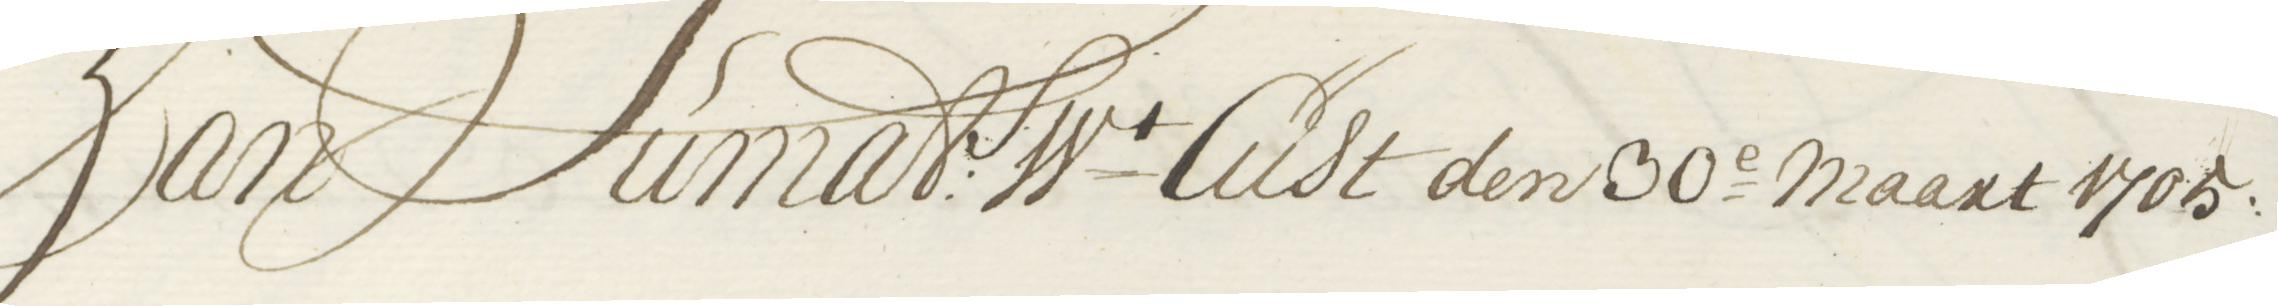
Van Sumat:s W=t Cust den 30=e Maart 1705:
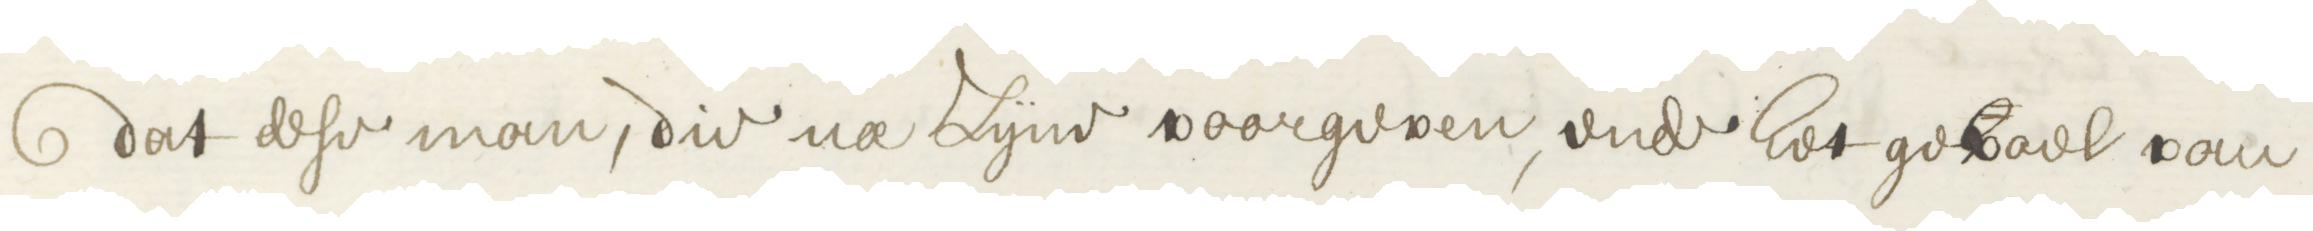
dat dese man, die na zijne voorgeven, ende het gevoel van
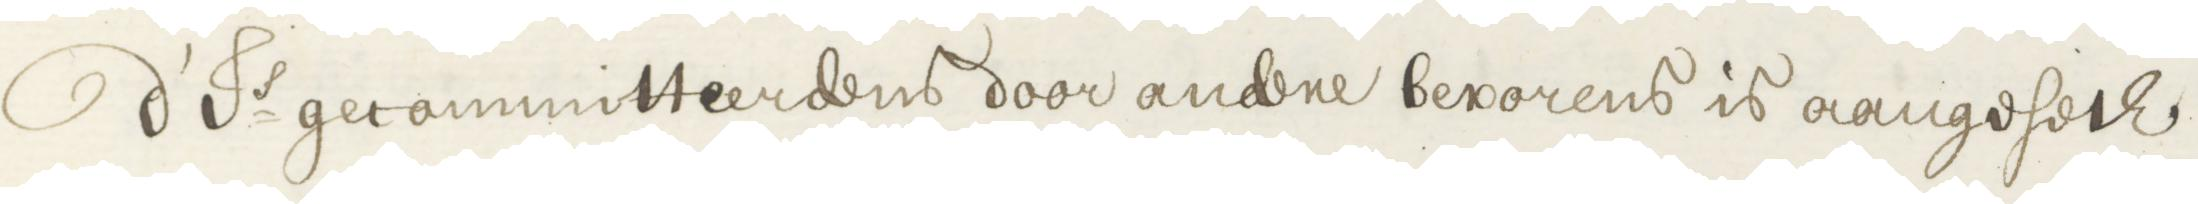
d’ E=s gecommitteerdens door andere bevorens is aangeseth
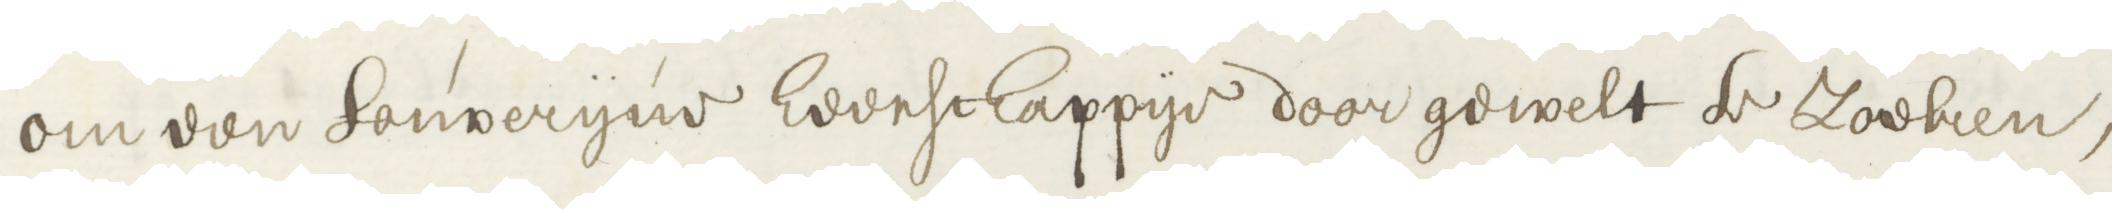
om een souverijne heerschappije door gewelt te zoeken,
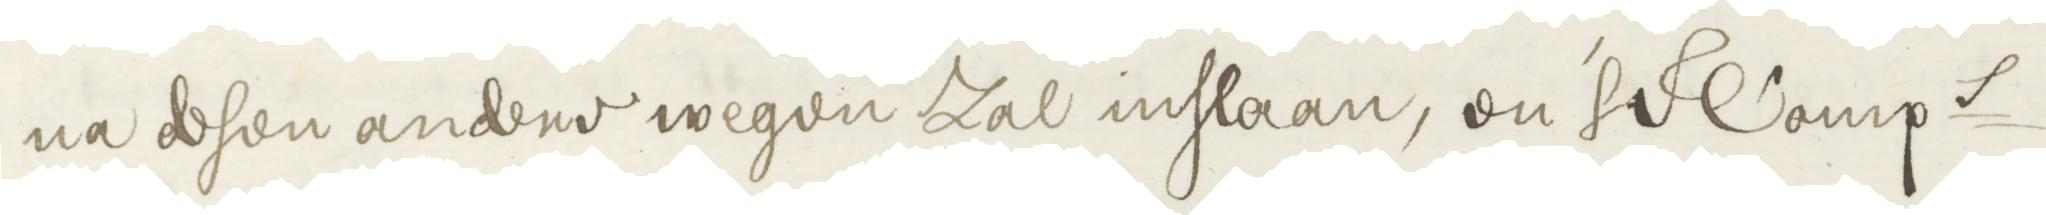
na desen andere wegen zal inslaan, en ’s E Comp:s
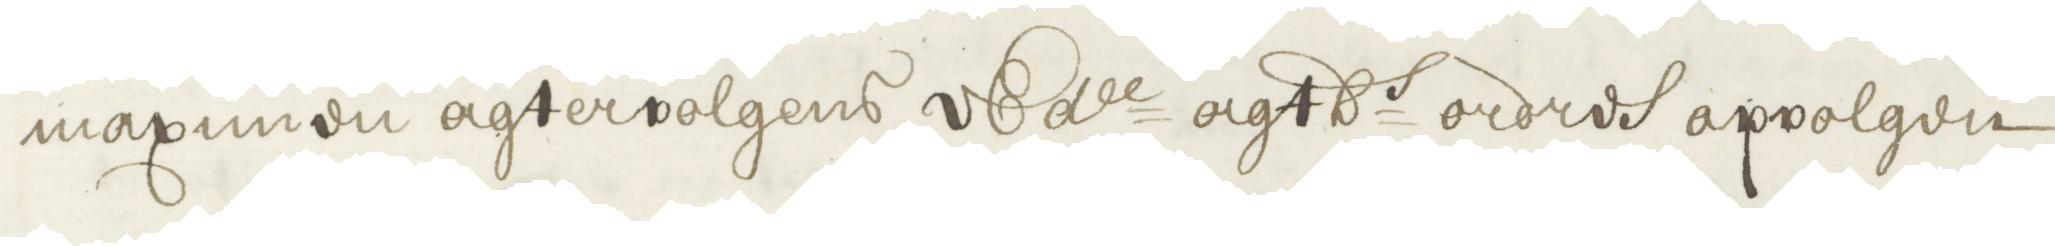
maximen agtervolgens uEd=e agtb=s ordres opvolgen
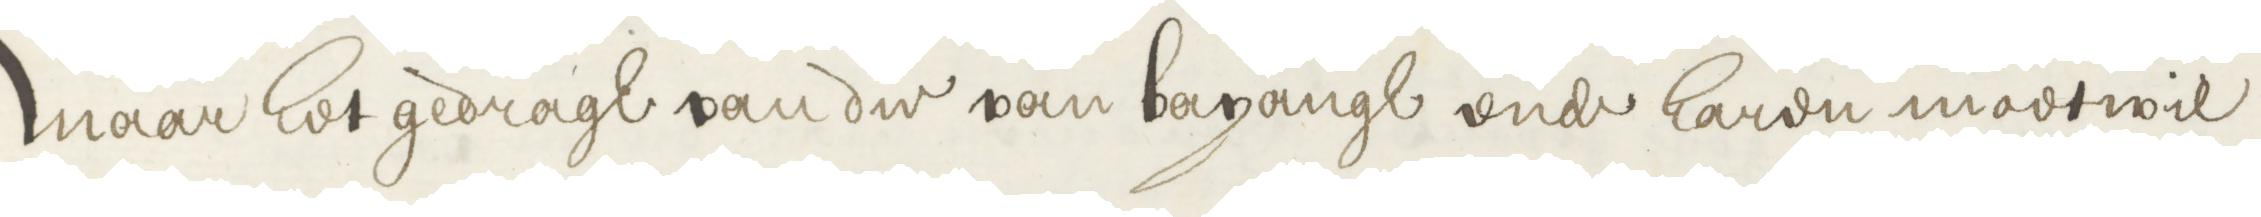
Maar het gedragh van die van baijangh ende haren moetwil
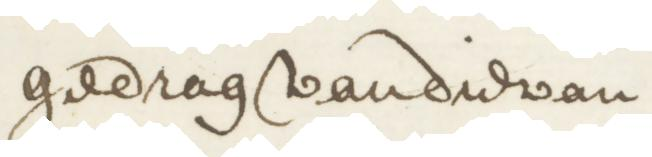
gedrag van die van
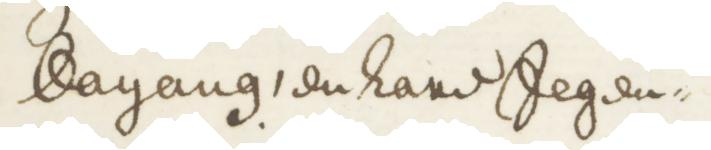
baijang, en hare jegen„
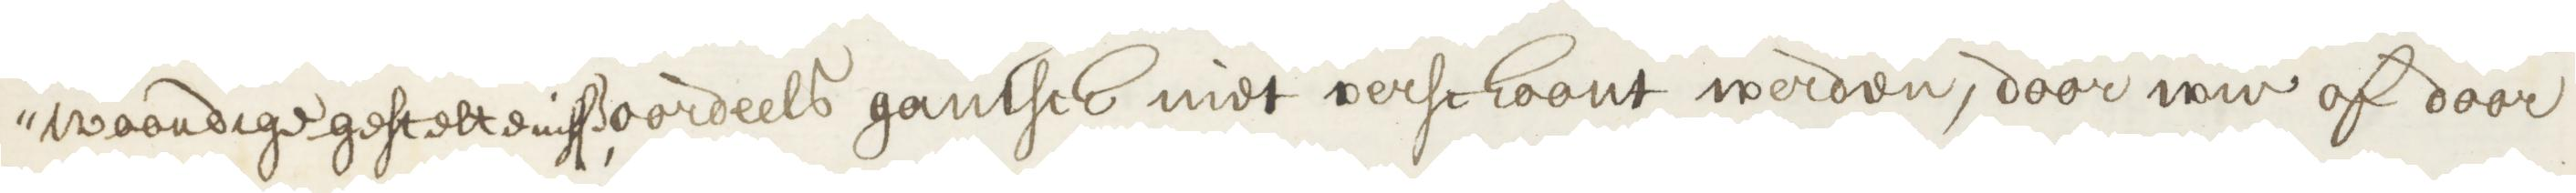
„woordige gesteltenisse oordeels gantsch niet verschoont werden, door wie of door
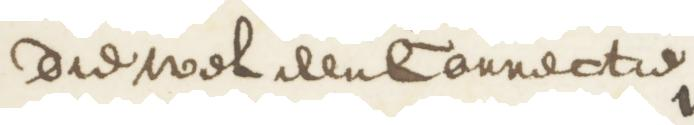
die wel een correctie
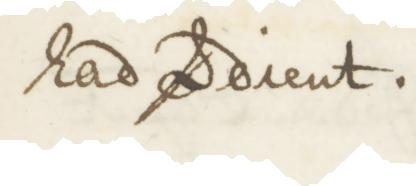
had verdient.
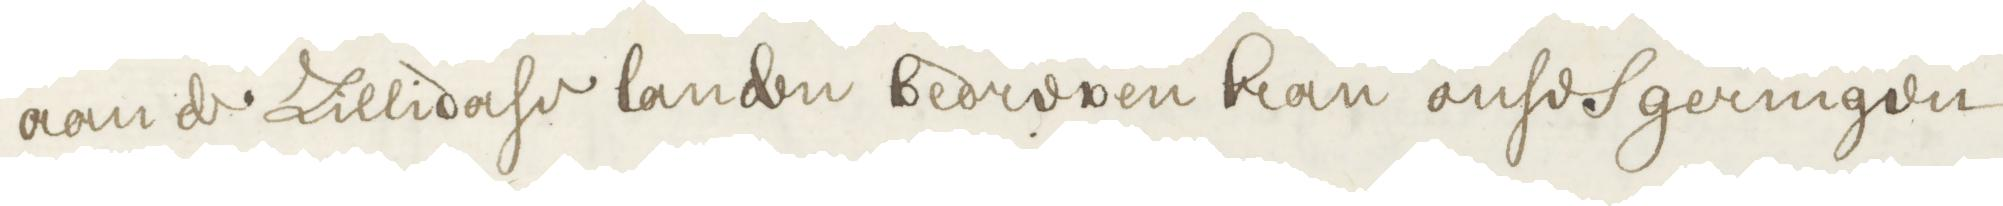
aan de zillidase landen bedreven kan onses geringen
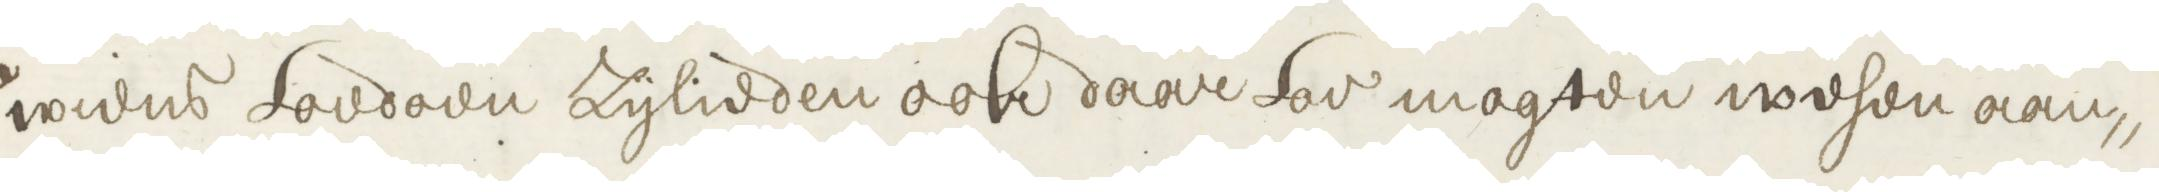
wiens toedoen zijlieden ook daar toe mogten wesen aan„
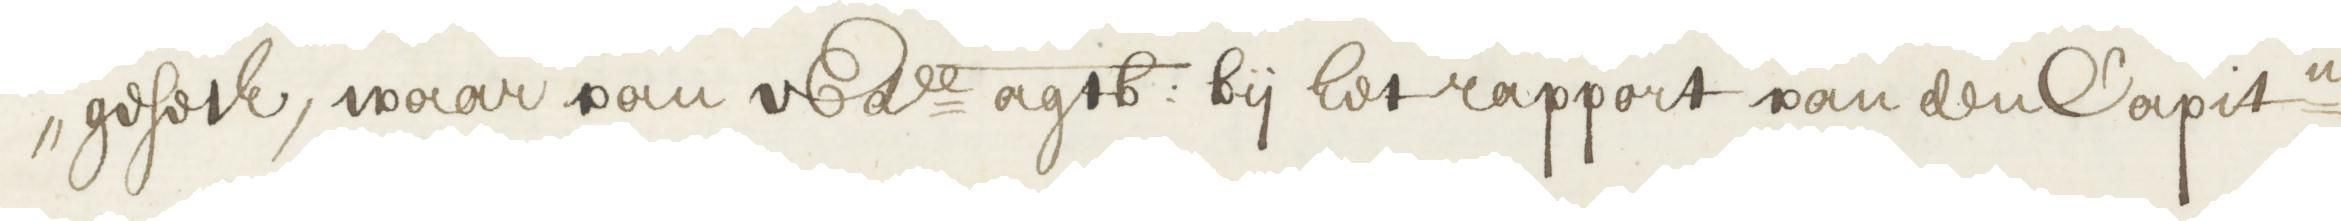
„geseth, waar van uEd=e agtb: bij het rapport van den Capit=n
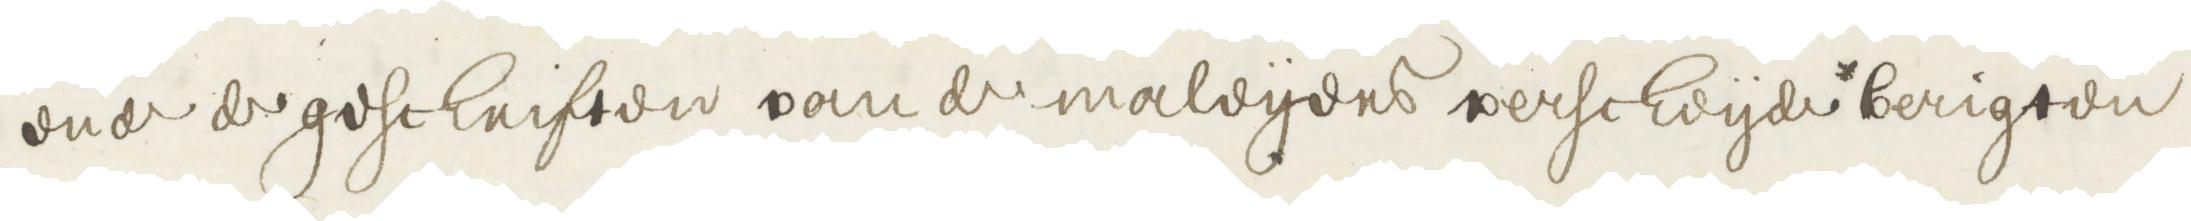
ende de geschriften van de maleijers verscheijde berigten
